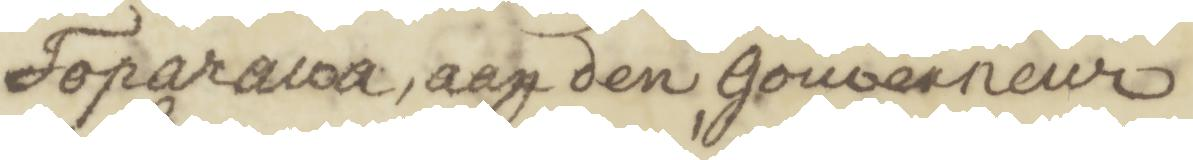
Toparawa, aan den gouverneur
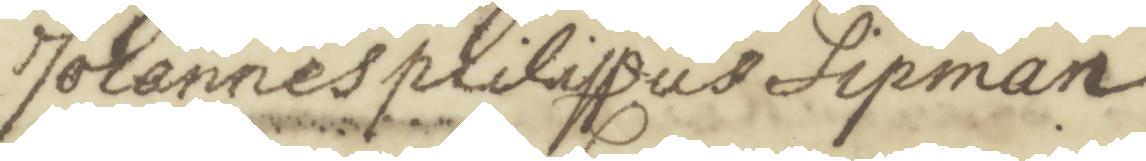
Johannes philippus Sipman
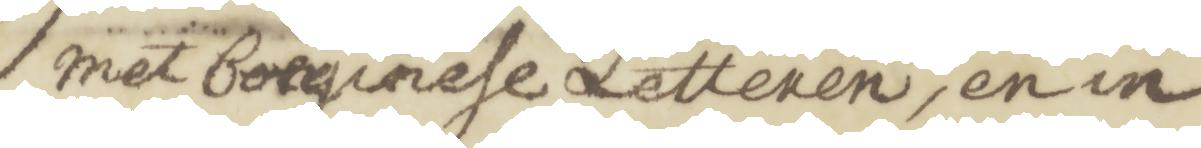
met boeginese Letteren, en in
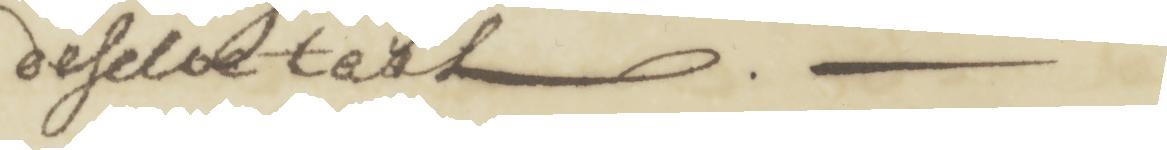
deselve taal. —
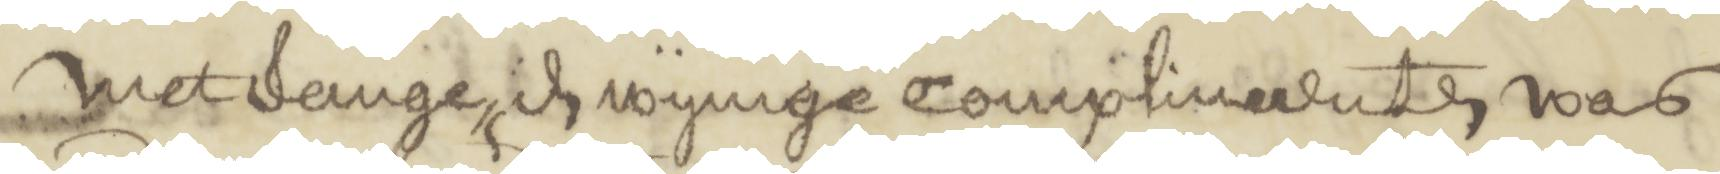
met Eenige, en wijnige complimenten was
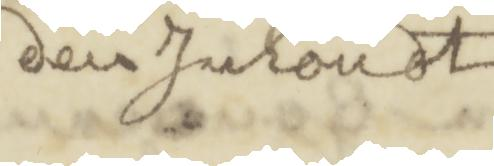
den Jnhoudt
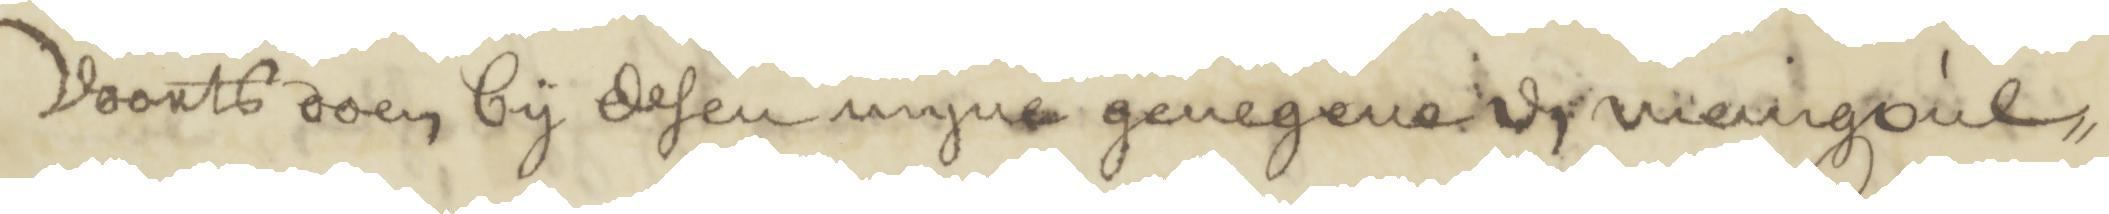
Voorts doen bij desen mijne genegene en meningvul„
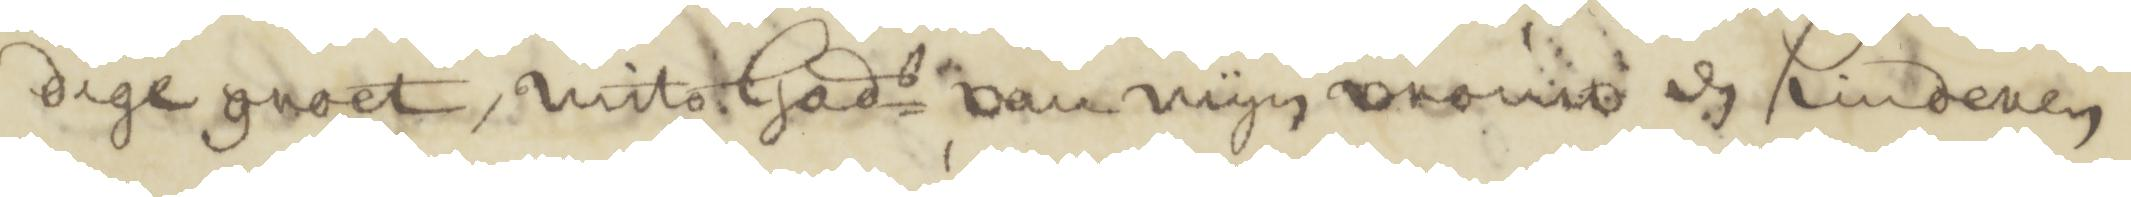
dige groet, mits Gad=s van mijn vrouw en kinderen
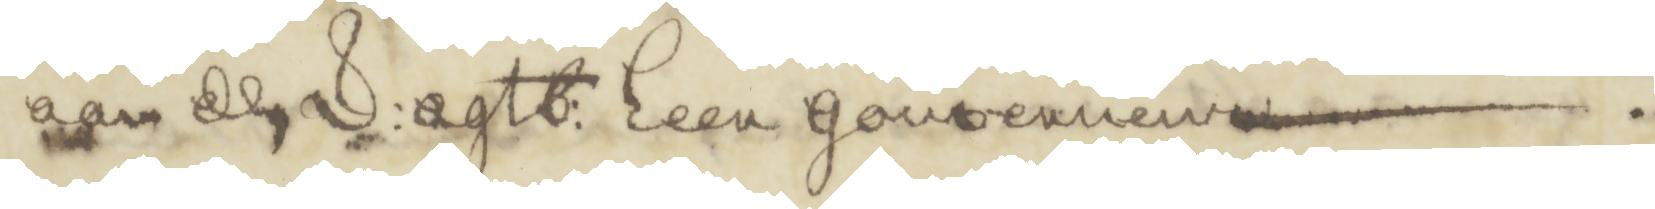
aan den E: agtb: heer gouverneur —
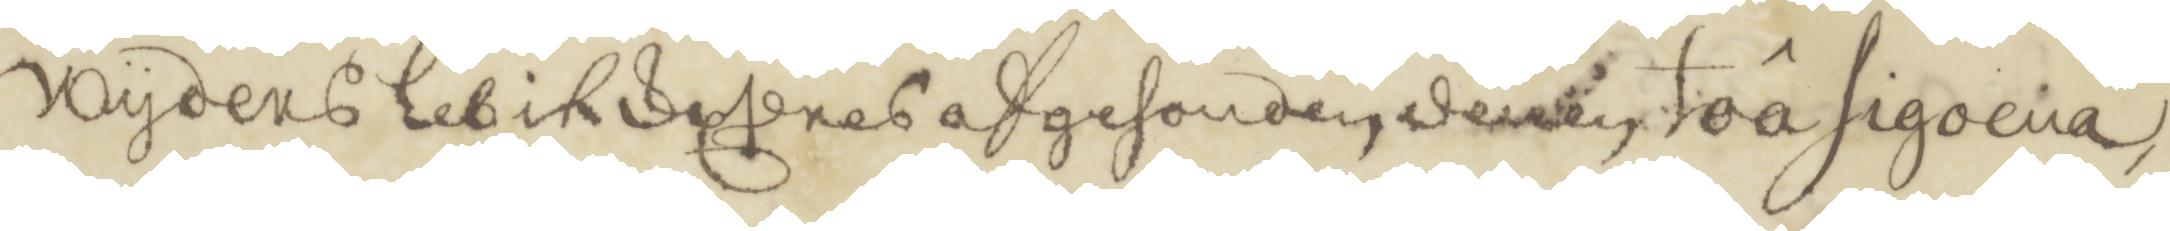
wijders heb ik Expres afgesonden eenen toâ sigoena,
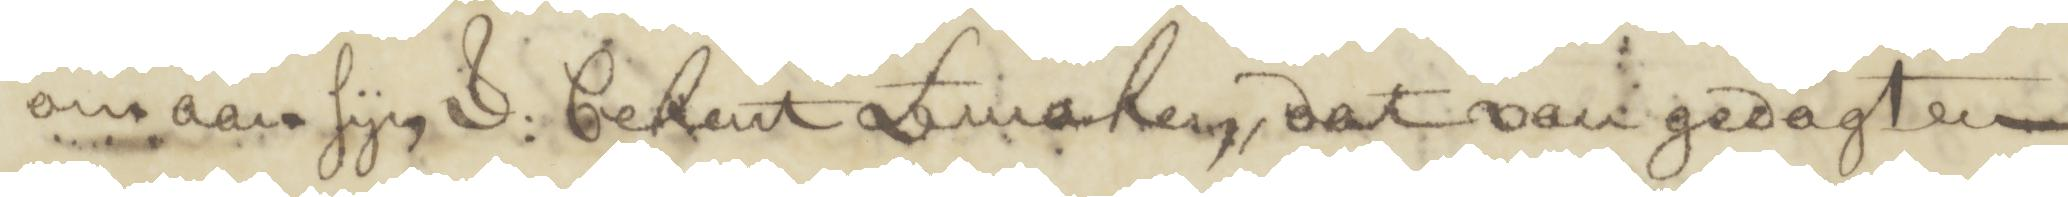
om aan sijn E: bekent temaken, dat van gedagte
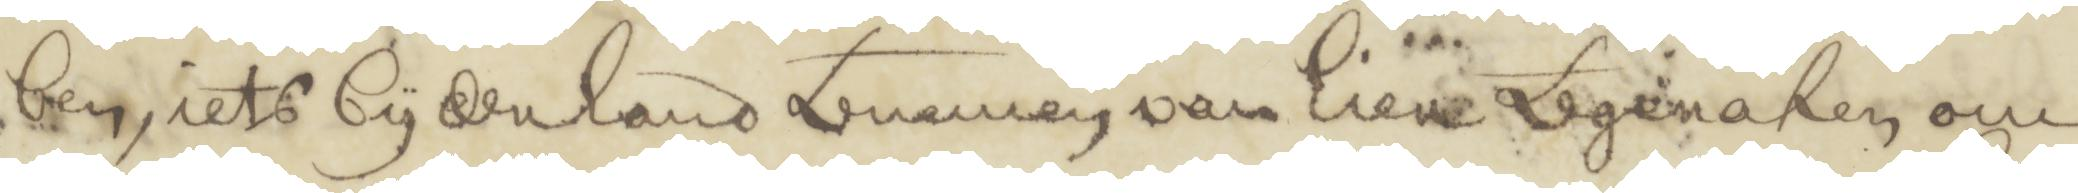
ben, iets bij den hand tenemen van hier tegenaken om
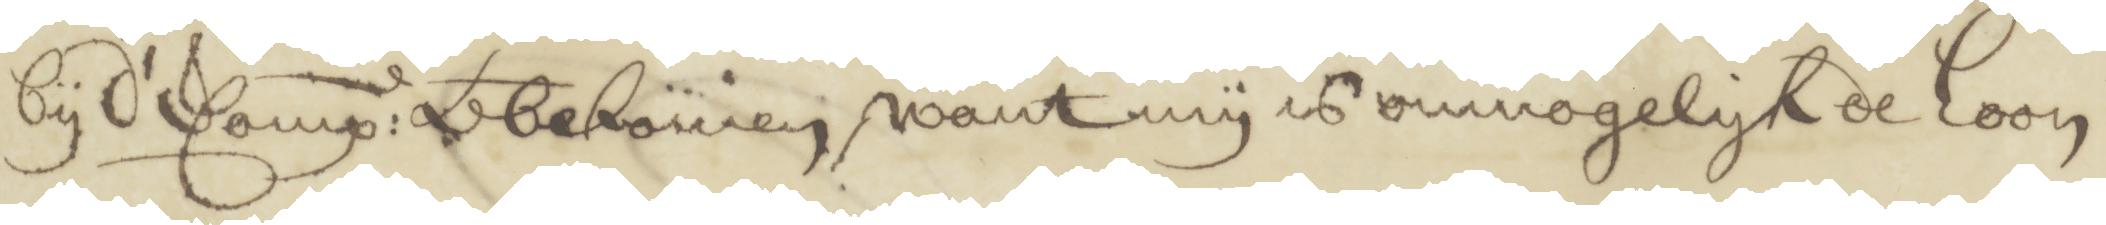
bij d’EComp:s te bekomen, want mij is ommogelijk de hoon
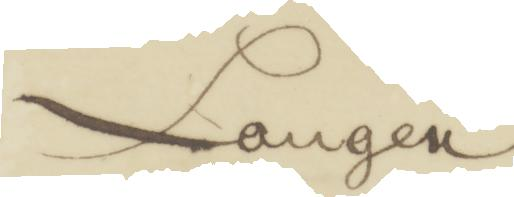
Langer
